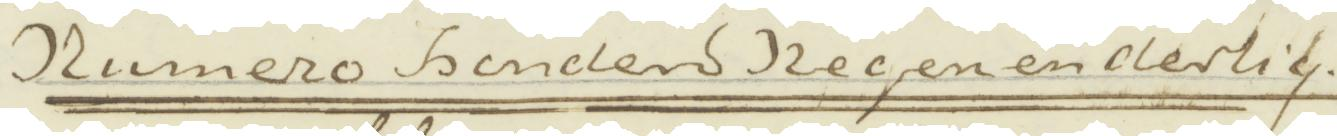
Numero honderd Negen en dertig
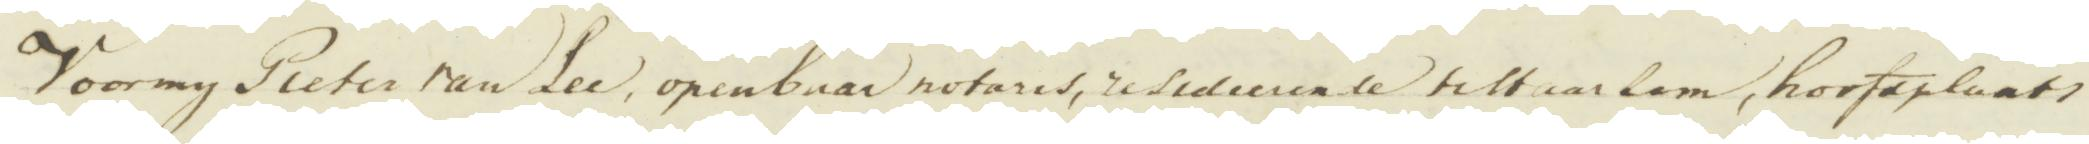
Voor my Pieter van Lee, openbaar notaris, resideerende te Haarlem, hoofdplaats
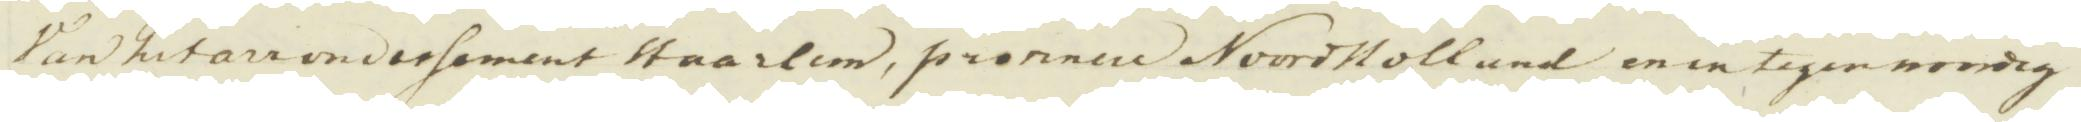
Van het arrondissement Haarlem, provincie Noord Holland en in tegenwoordig
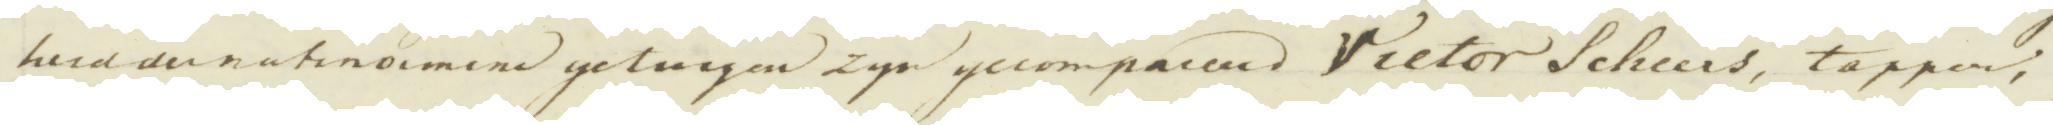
heid der na te noemene getuigen zyn gecompareerd Victor Scheers, tapper,
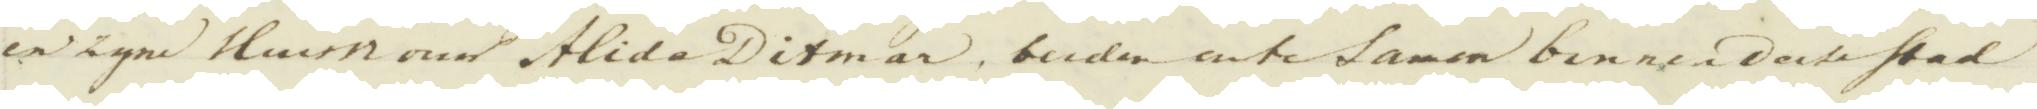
en zyne Huisvrouw Alida Ditmar, beiden en te Samen binnen deese Stad
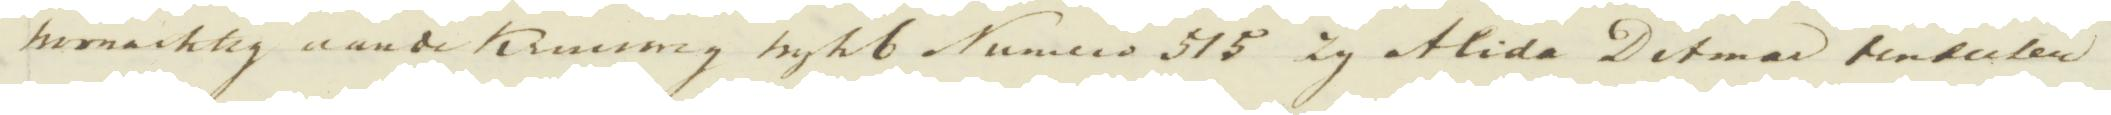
woonachtig aan de Kruisweg wyk 6 Numero 515 Zy Alida Ditmar ten deesen
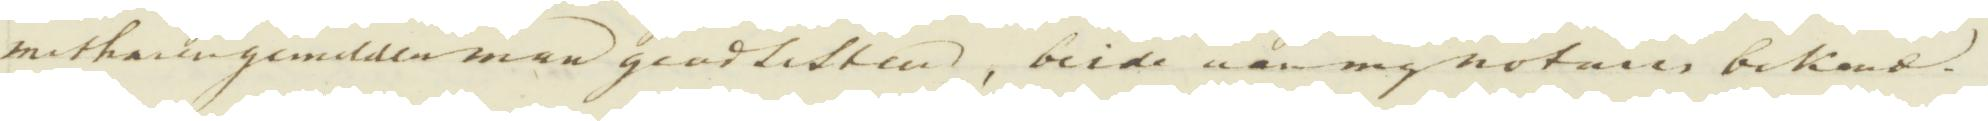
met haren gemelden man geadsisteerd, beide aan my notaris bekend.
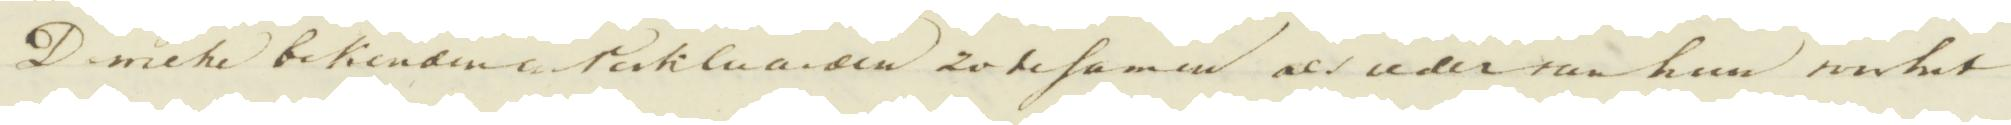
Dewelke bekenden en Verklaarden zo te Samen als ieder van hun voor het
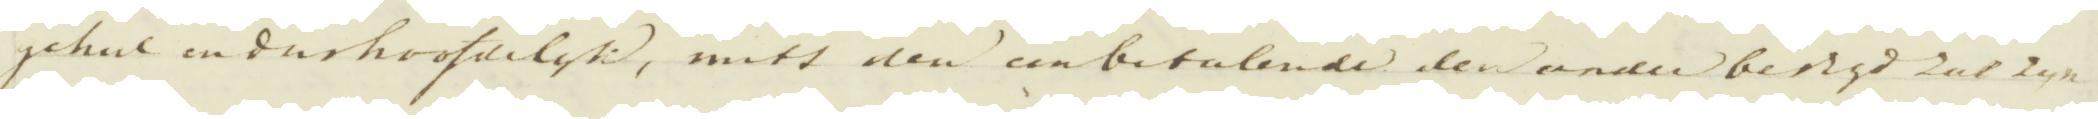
geheel en dus hoofdelyk, mits den een betalende den ander bevryd zal zyn
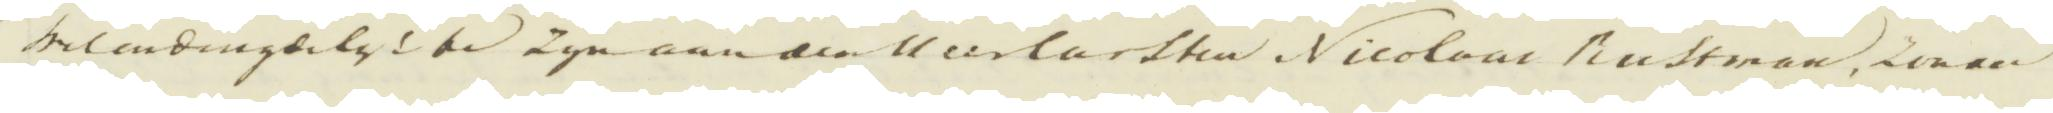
Wel en deugdelyk te Zyn aan den Heer Carsten Nicolaas Rustman, Zonder
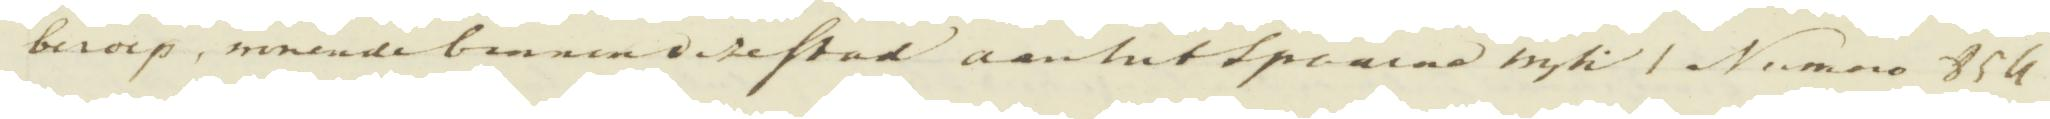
beroep, wonende binnen deze stad aan het Spaarne wyk 1 Numero 854
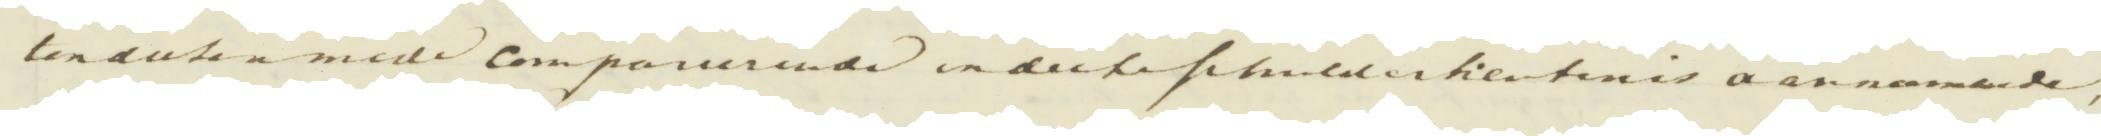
ten deesen mede compareerende en deeze schuld erkentenis aannemende,
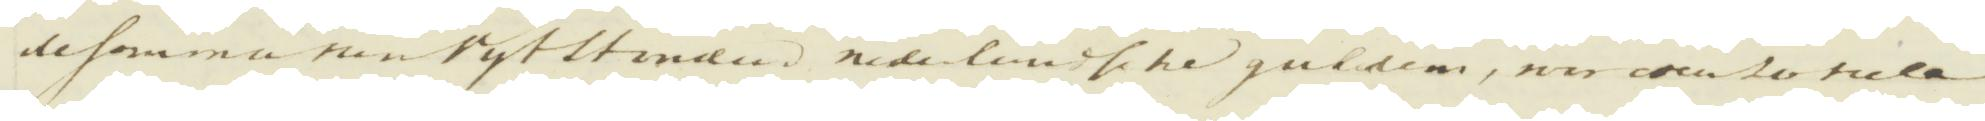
de Somma van Vyf Honderd nederlandsche guldens, voor den zo veele
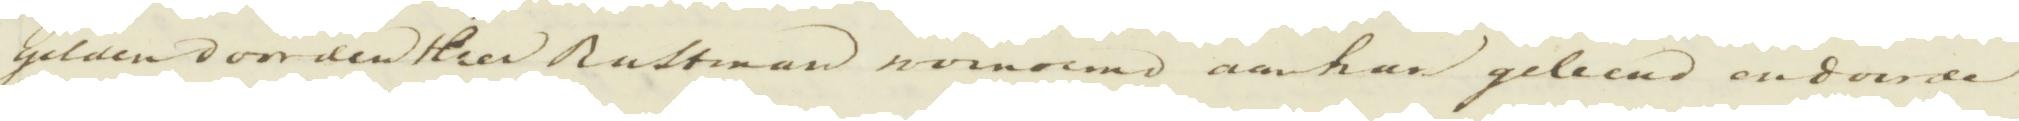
gelden door den Heer Rustman voornoemd aan hun geleend en door de
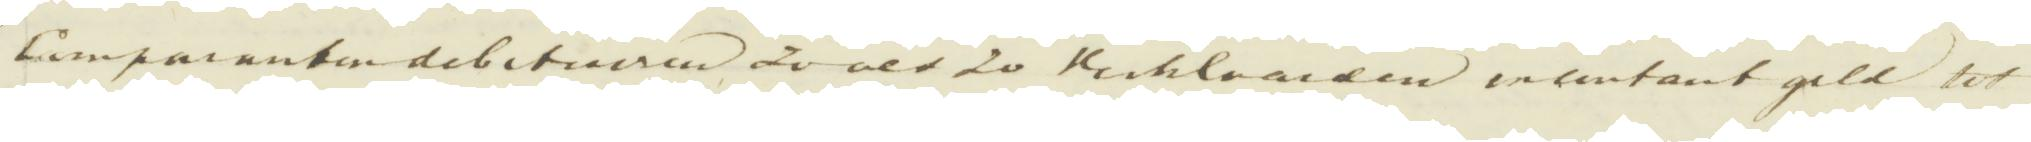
Comparanten debiteuren Zoals ze Verklaarden in contant geld tot
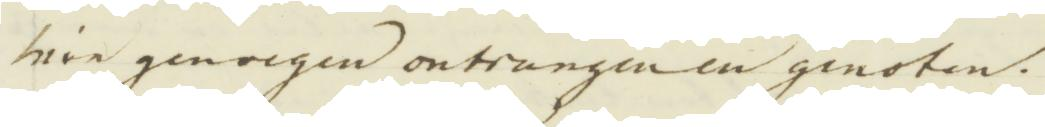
hun genoegen ontvangen en genoten.
